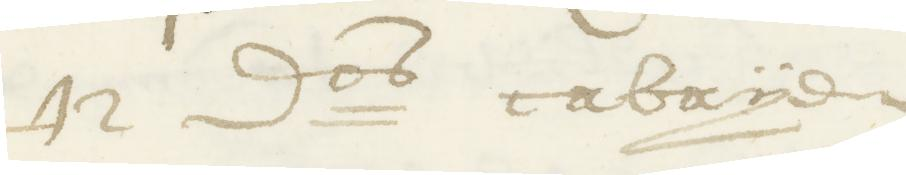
42 d=os cabaijen
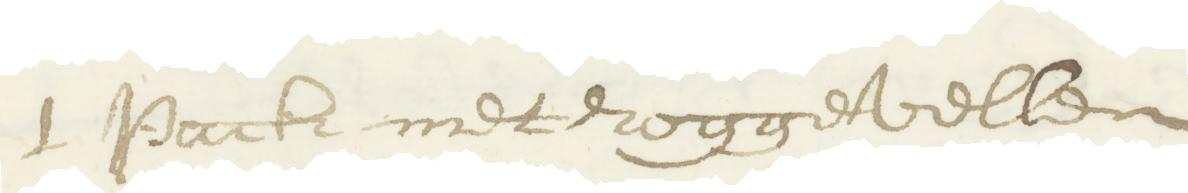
1 pack met roggevellen
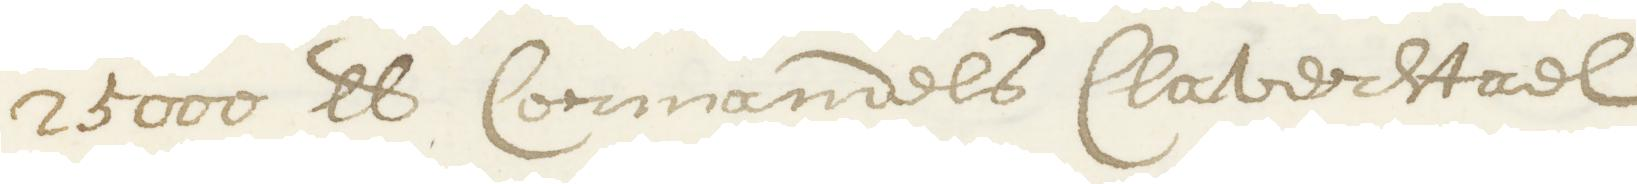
25000 lb Cormandels Claverstael
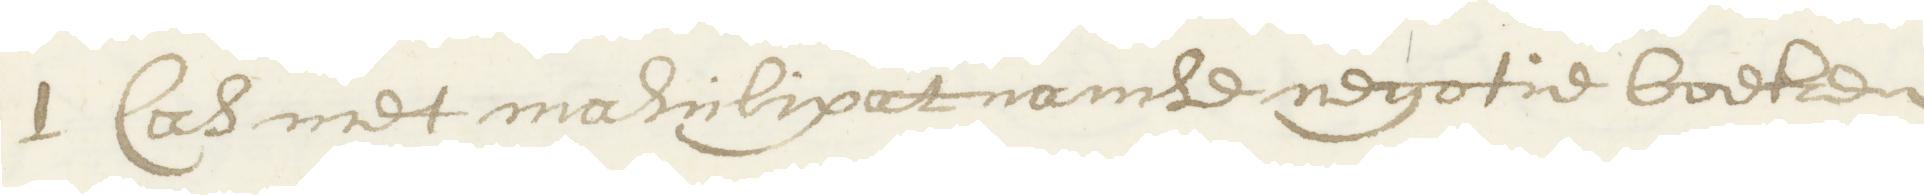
1 Cas met masulipatnamse negotie boeken
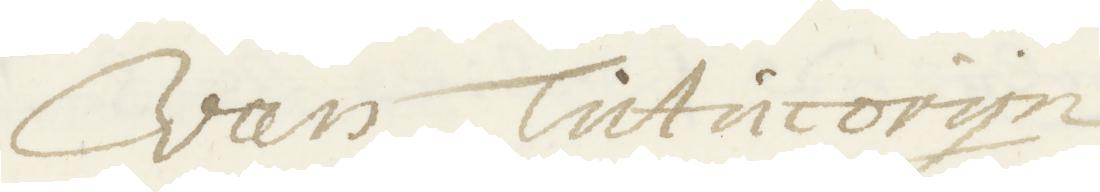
van Tutucorijn
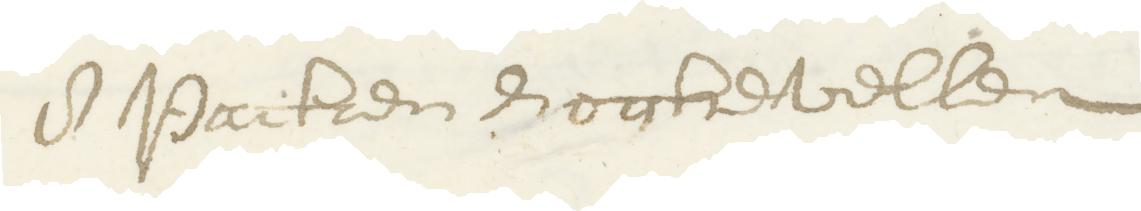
8 packen roghevellen
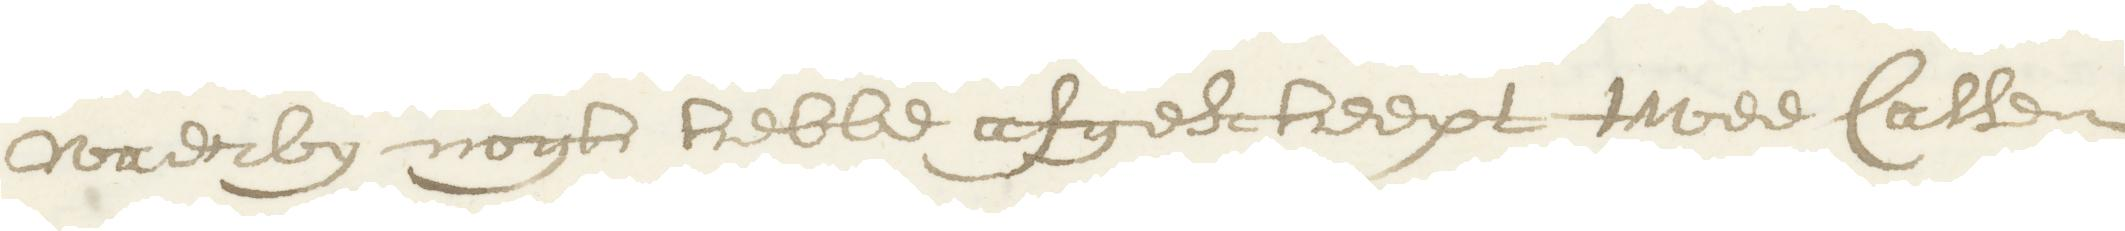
waerbij nogh hebbe afgescheept twee Cassen
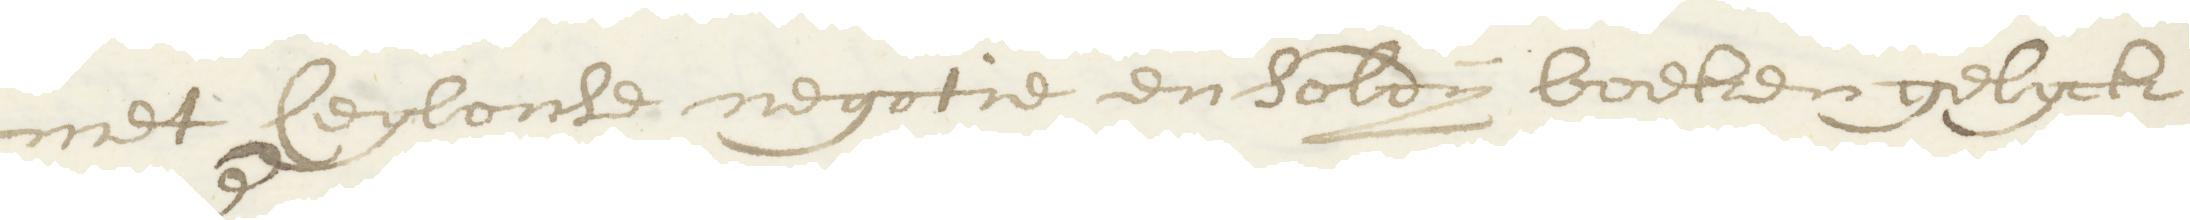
met Ceijlonse negotie en soldij boeken gelyck
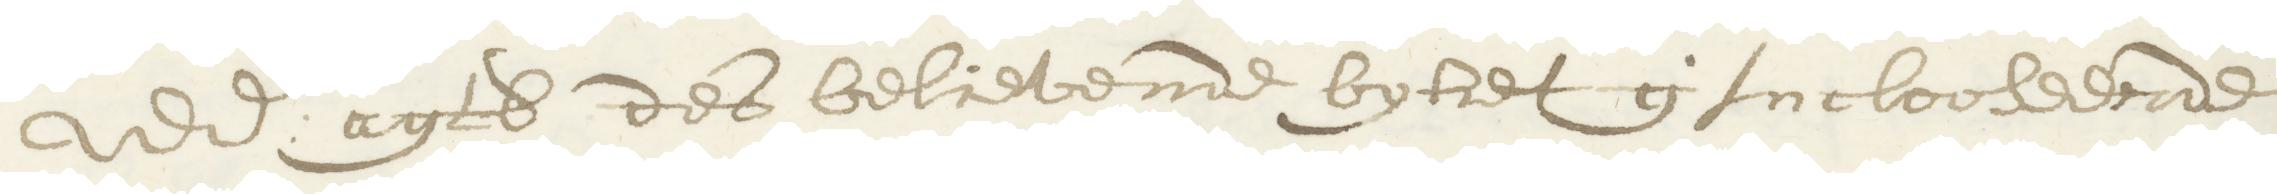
uEE: agtb des believende by het g' jnclooseerde
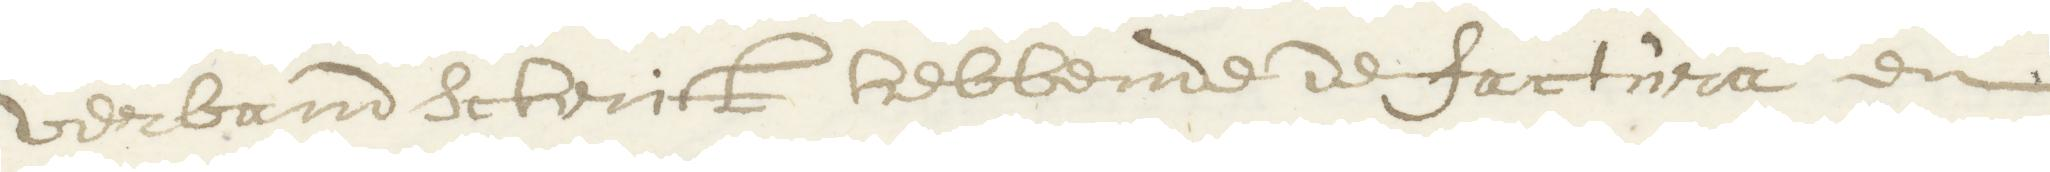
verband schrift hebbende de factura en
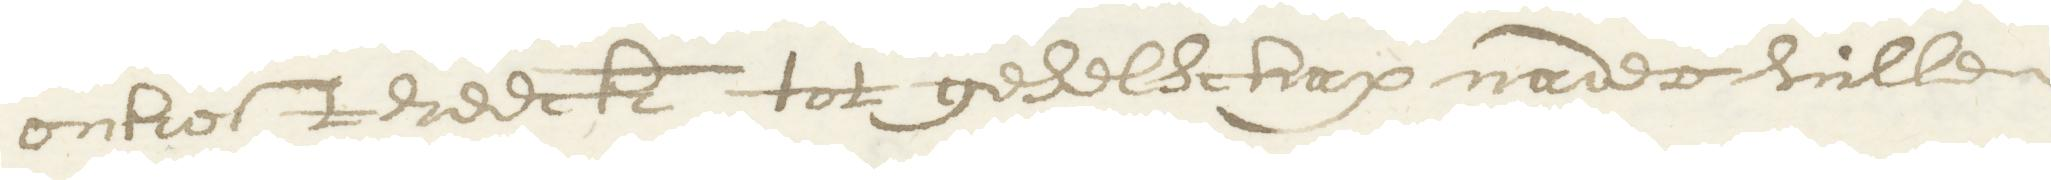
onkostreeck tot geselschap nader sullen
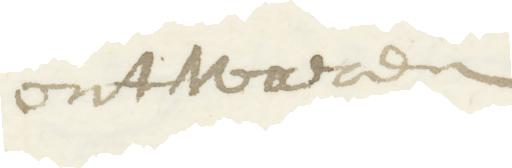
ontwaeren
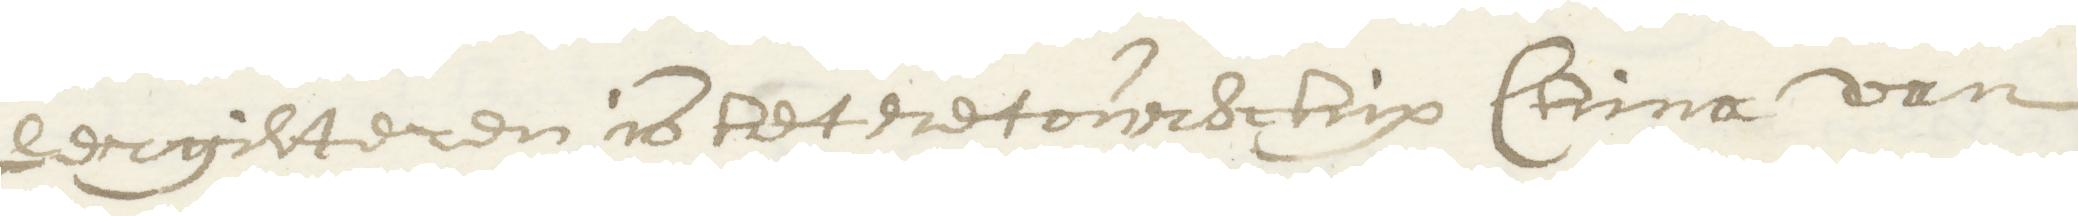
Eergisteren is het retourschip China van
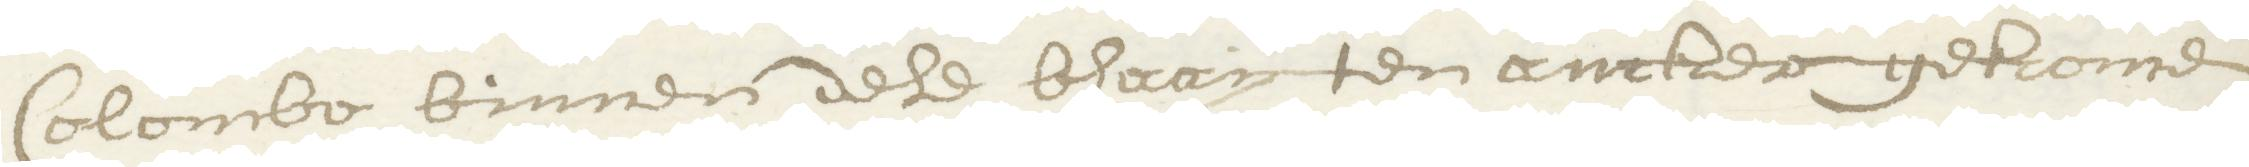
Colombo binnen dese bhaaij ten ancker gekomen
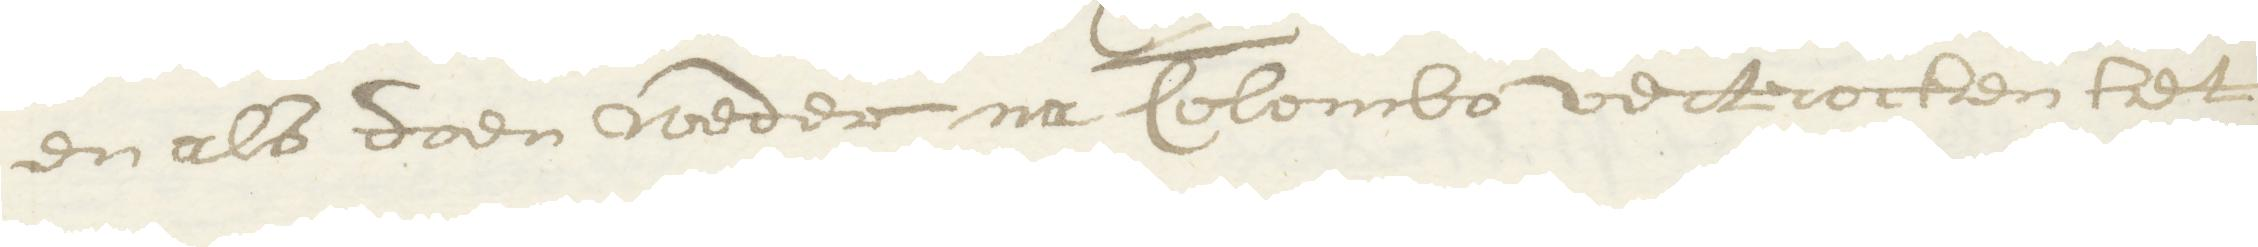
en als doen weder na Colombo vertrocken het
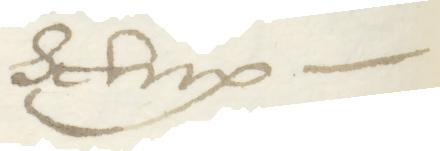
schip —
